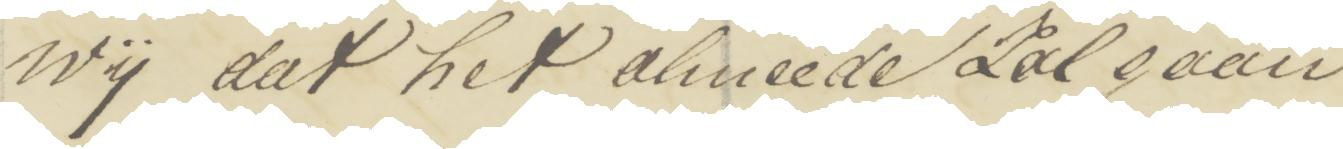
wij dat het almeede Zal gaan
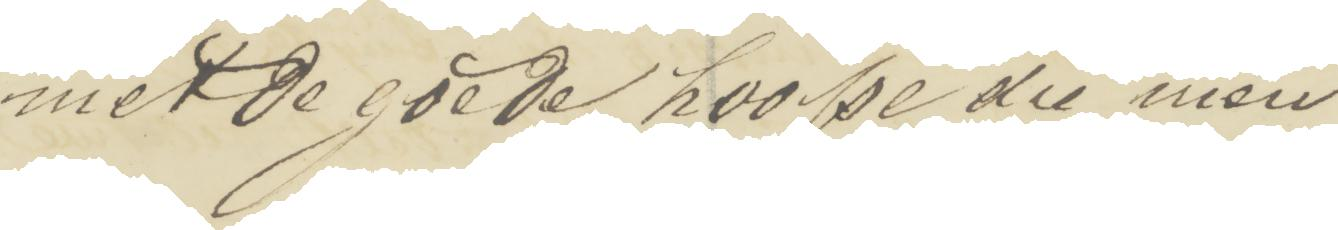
met de goede hoope die men
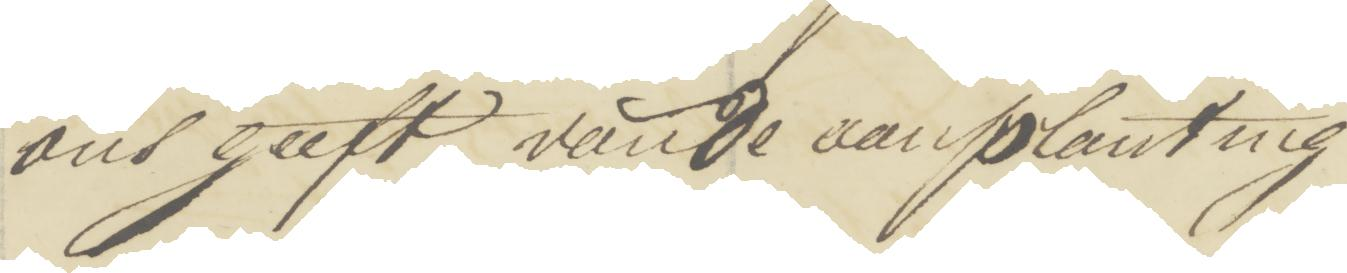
ons geeft vande aanplanting
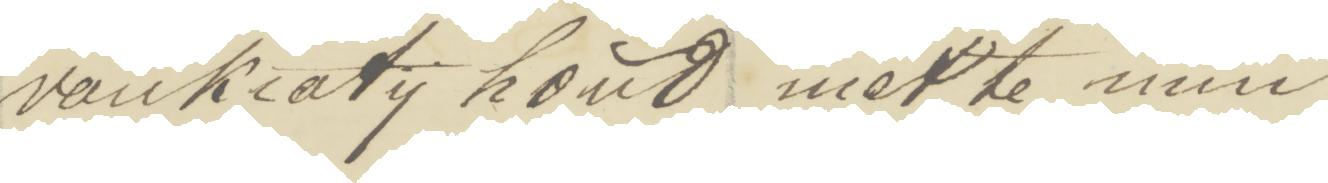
van kiatij houd niet te min
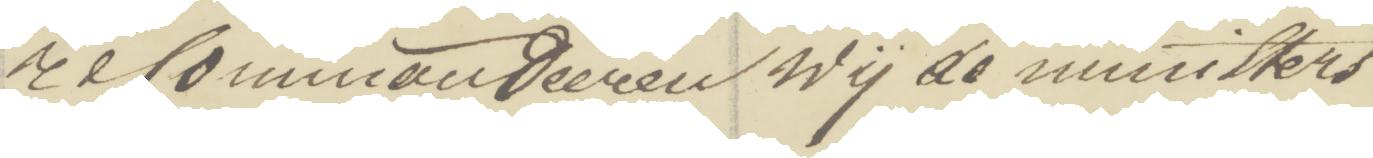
recommandeeren wij de ministers
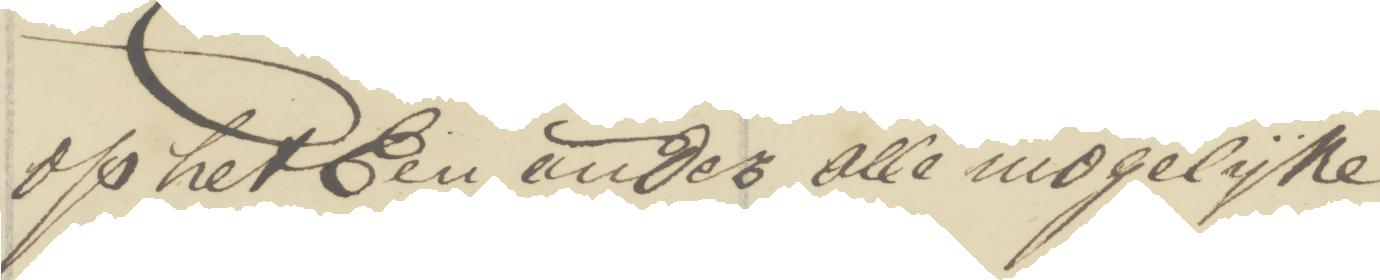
op het Een ander alle mogelijke
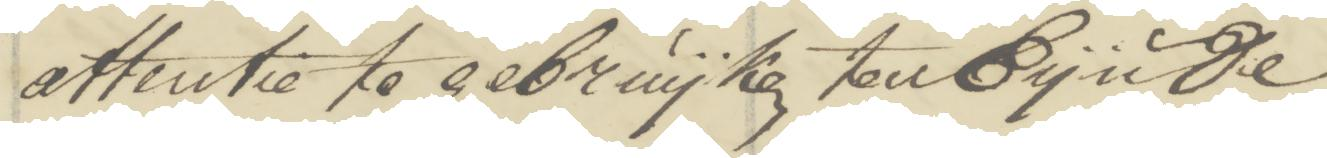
attentie te gebruijken ten Eijnde
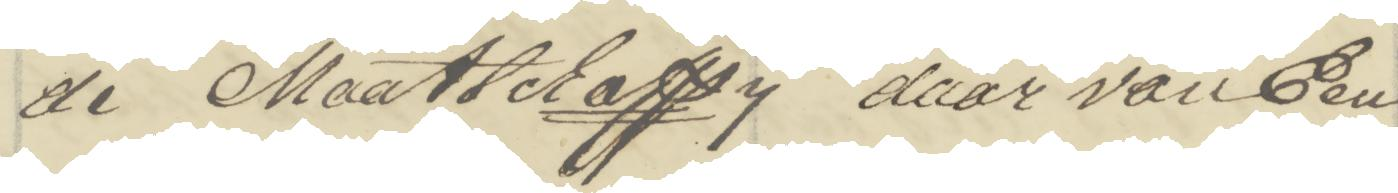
de Maatschappij daar van Een
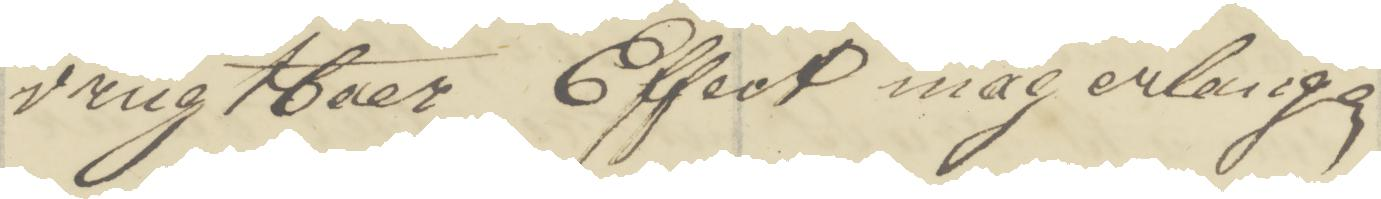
vrugtbaer Effect mag erlangen
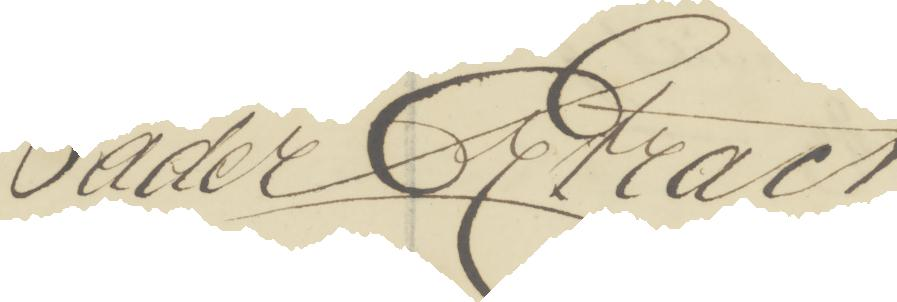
Nader extract
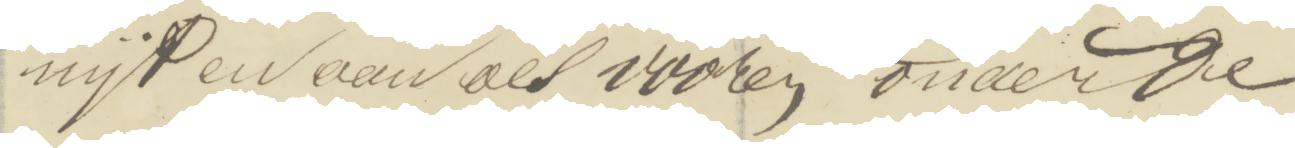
uijt en aan als vooren onder de
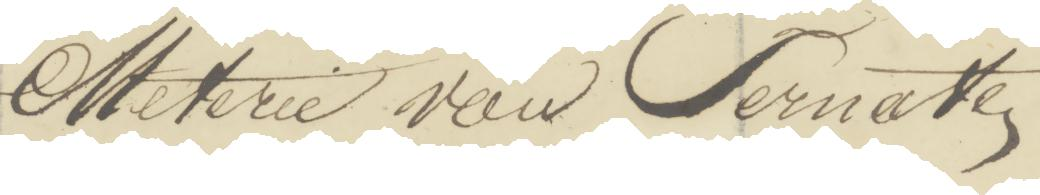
Meterie van Ternaten
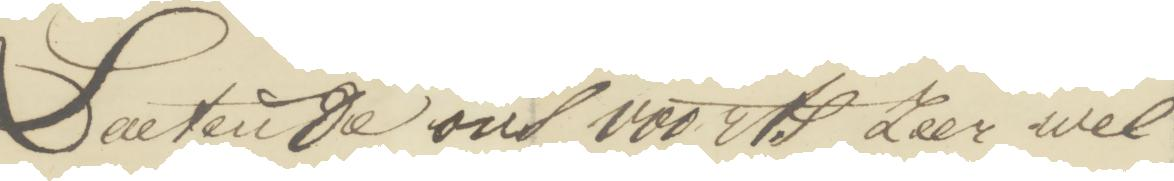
Laeten de ons voorts zeer wel
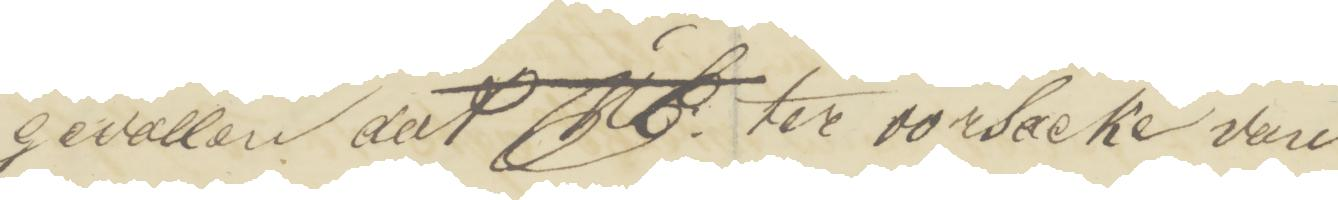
gevallen dat UE: ter oorsaeke van
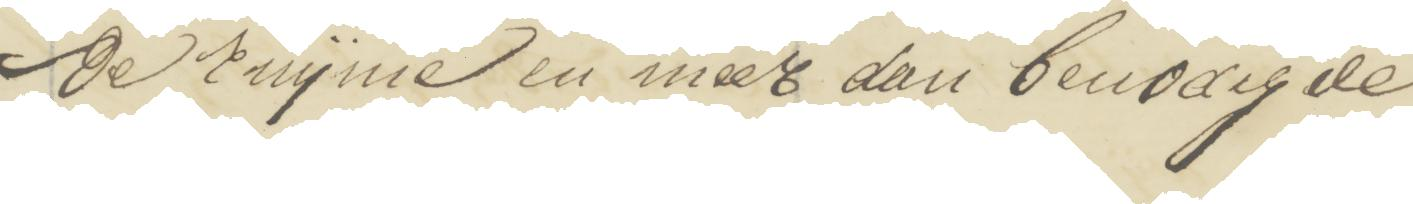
de ruijme en meer dan benodigde
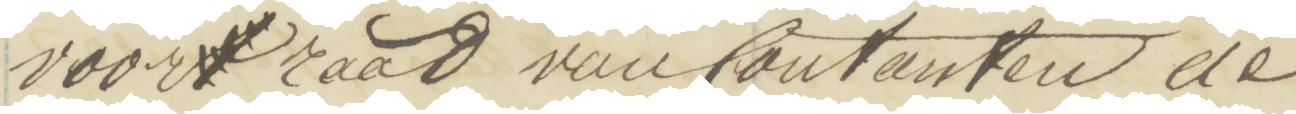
voortraad van Contanten de
